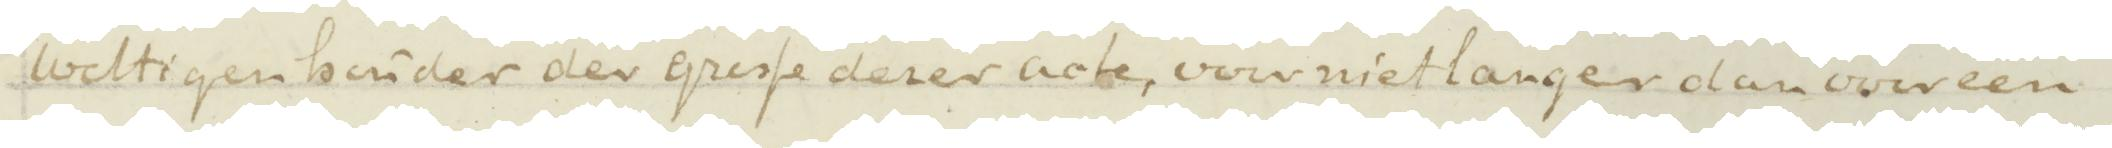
wettigen houder der grosse dezer acte, voor niet langer dan voor één
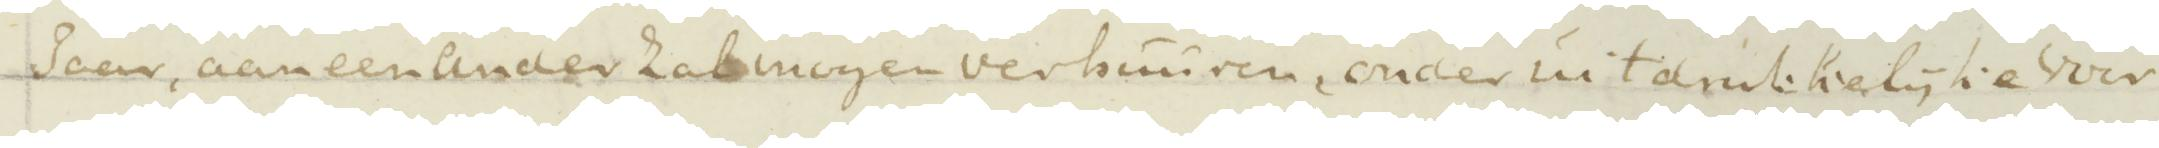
Jaar, aan een ander zal mogen verhuuren, onder uitdrukkelijke voor
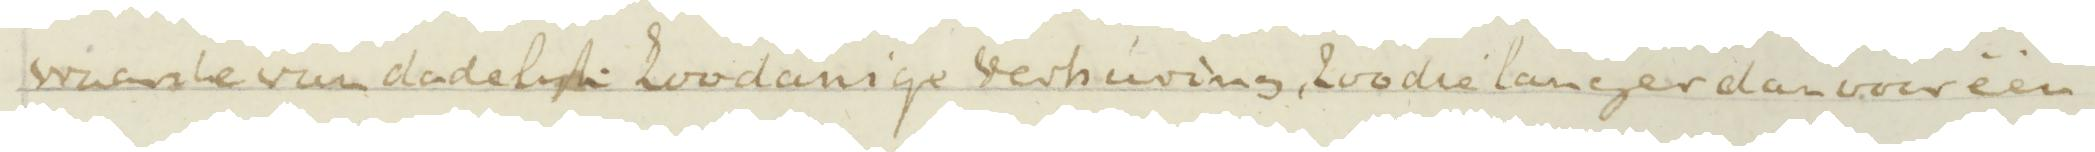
waarde van dadelyk zoodanige verhuring, zoo die langer dan voor één
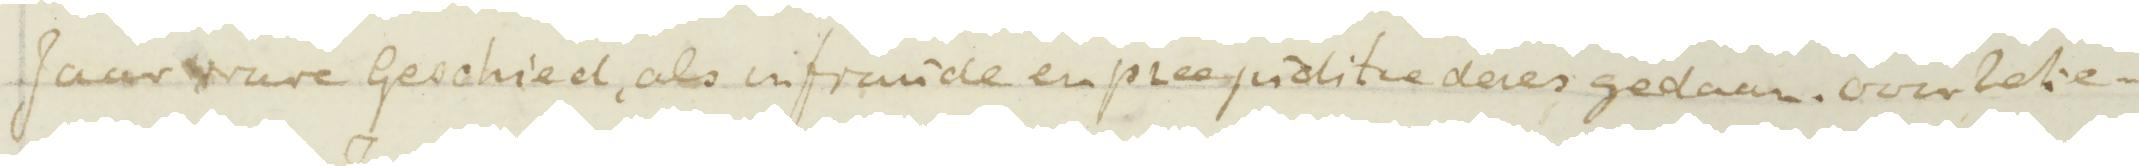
Jaar ware Geschied, als in fraude en preejuditie dezes gedaan. voor reke=
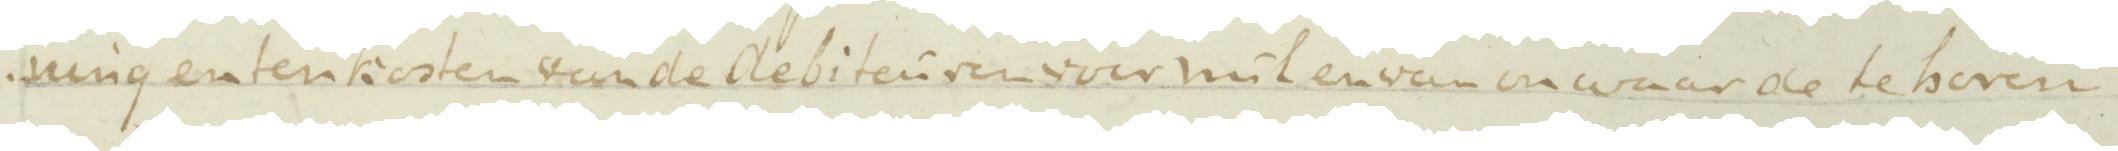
.ning en ten kosten van de debiteuren voor nul en van onwaarde te horen
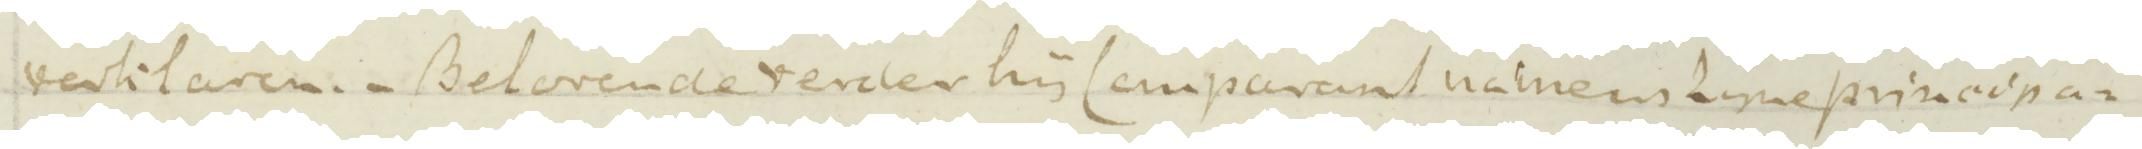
verklaren. – Belovende verder hij Comparant namens zyne principa=
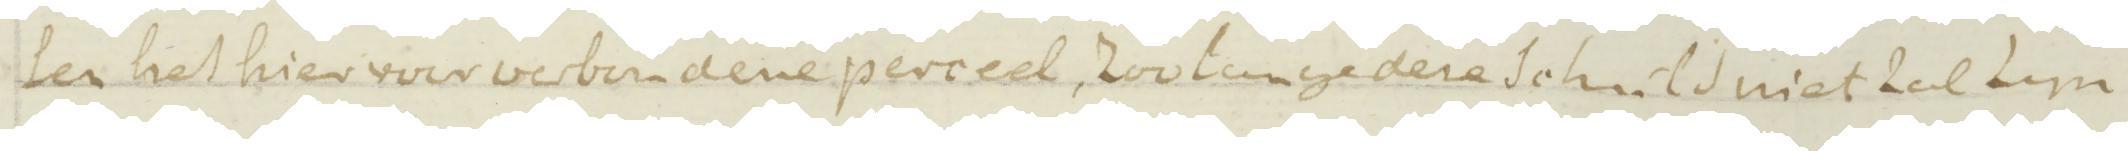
len het hier voor verbondene perceel, zoolange deze schuld niet zal zyn
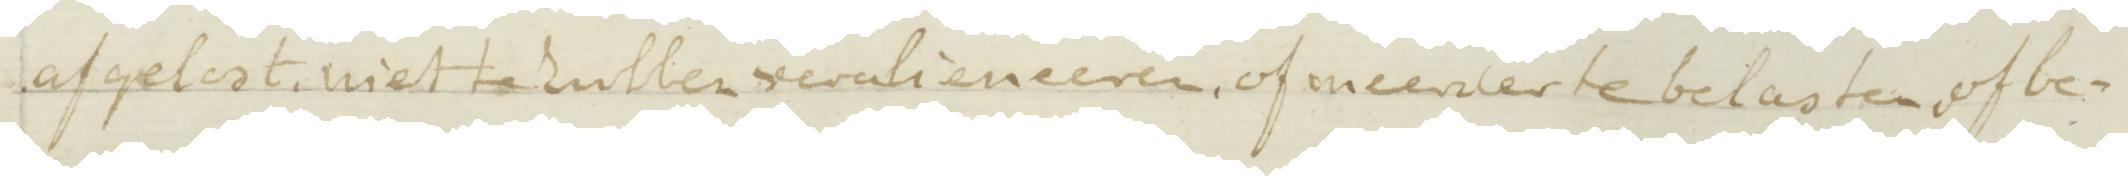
afgelost, niet te zullen veralieneeren, of meerder te belasten, of be-
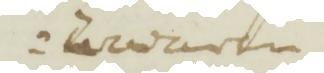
=zwaren.
